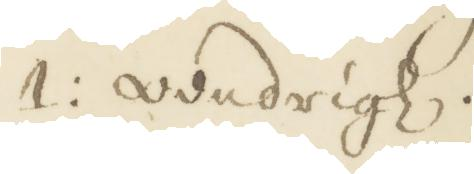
1: vendrigh.
